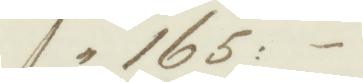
„ 165: —
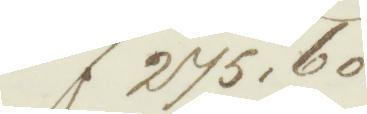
ƒ 275, 60
